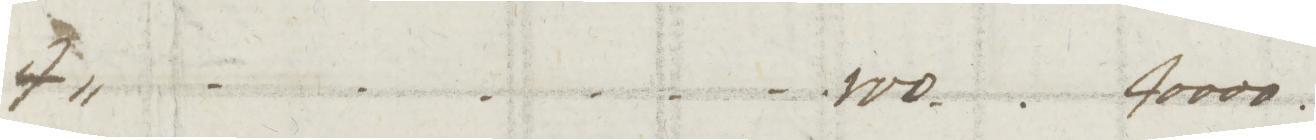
7 „ - - - - - - - 100 - - 40000
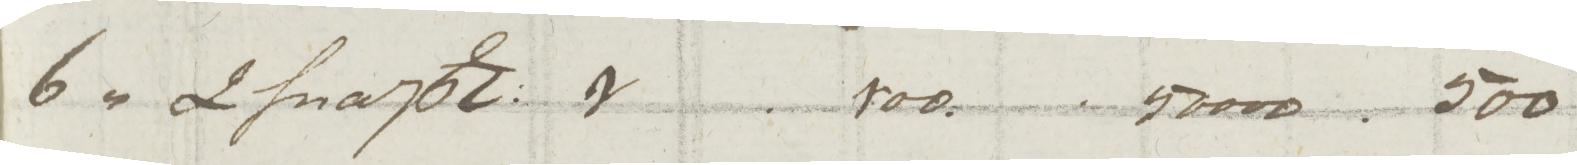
6 „ 2 snaph: 1 - 100 - - 50000 - 500
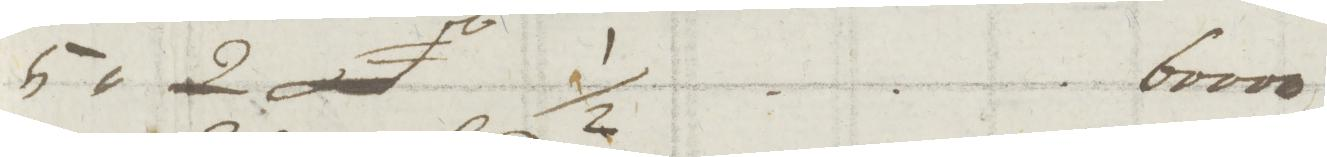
5 „ 2 D=o ½ - - - 60000
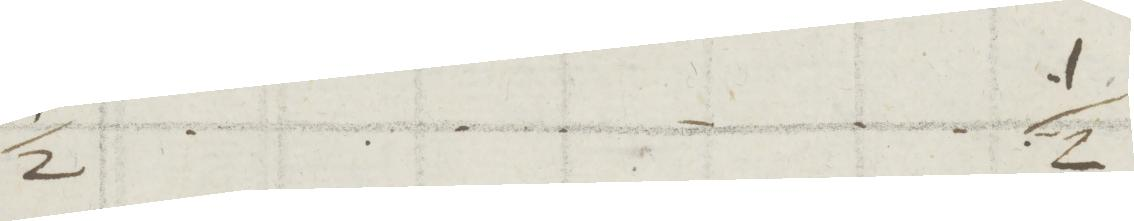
½ - - - - - - ½
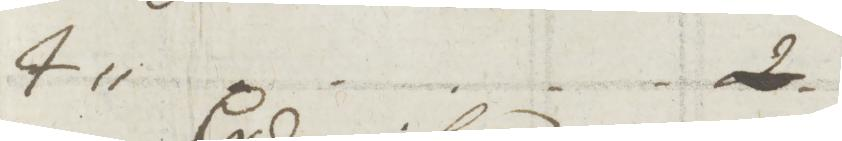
4 „ - - - - 2
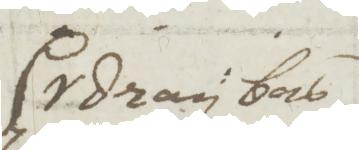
{ 1 draijbas
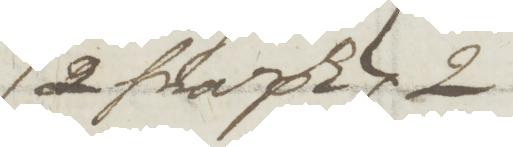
{ 2 snaph } 2
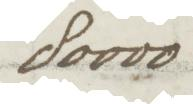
80000
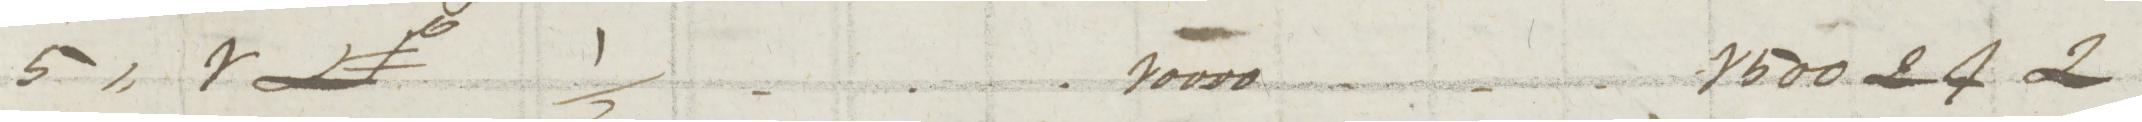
5 „ 1 D=o ½ - - - 10000 - - - 1500 24 2
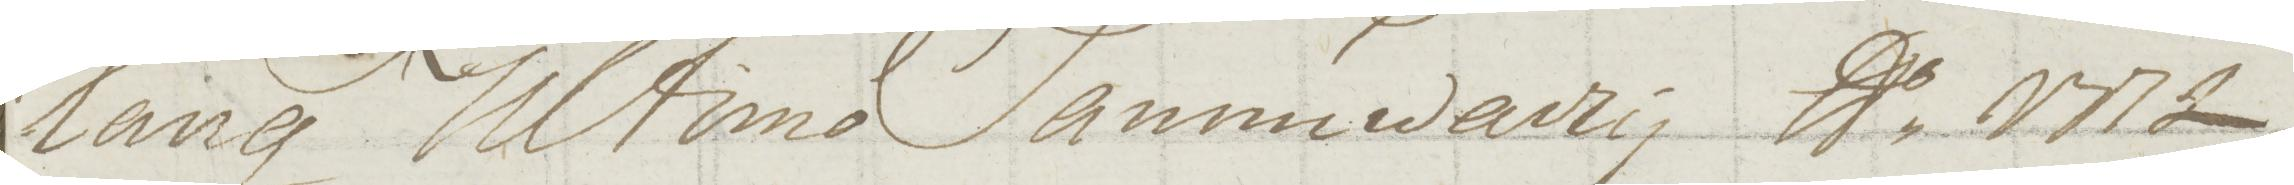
lang Ultimo Iannuwarij A„o 1772
